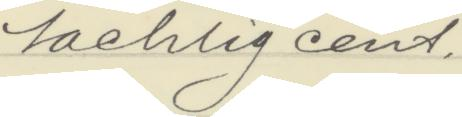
tachtig cent.
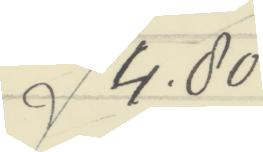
ƒ4.80
